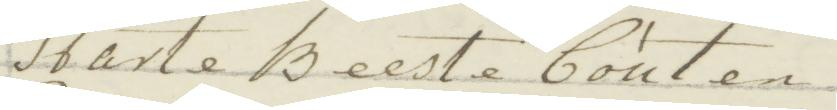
Harte Beeste bouten
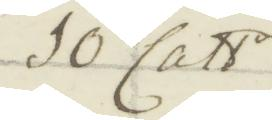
10 Catts
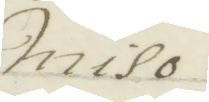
miso
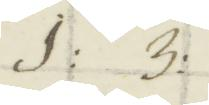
1: 3:
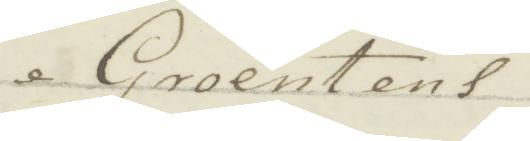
Groentens
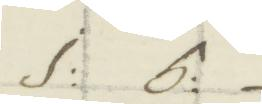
1: 6:
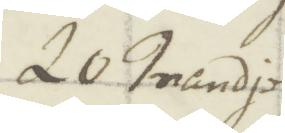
20 mandje
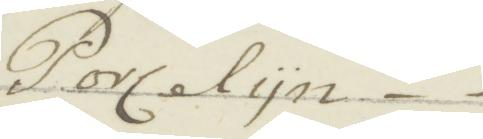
Porcelijn . - -
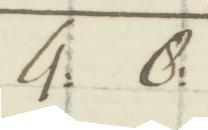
4: 8:
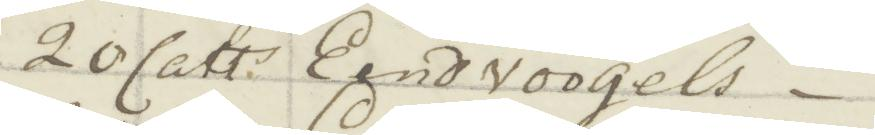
20 Catts Eend voogels —
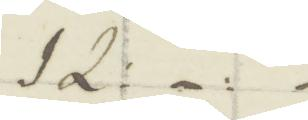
12: —:
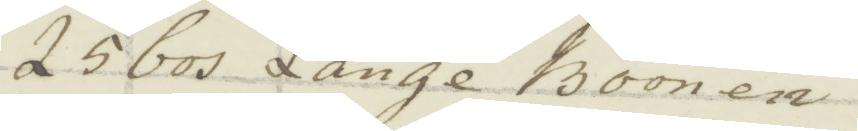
25 bos Lange Boonen
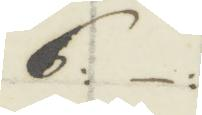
6: —:
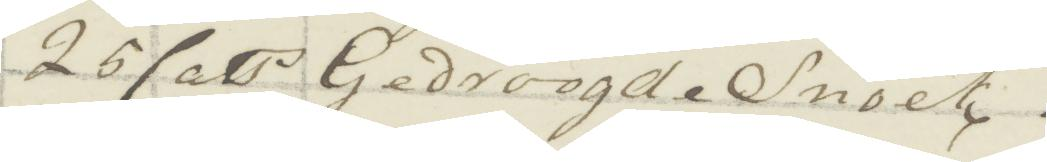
25 Catts Gedroogde Snoek
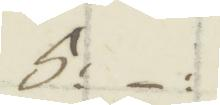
5: —.
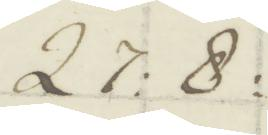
27: 8:
